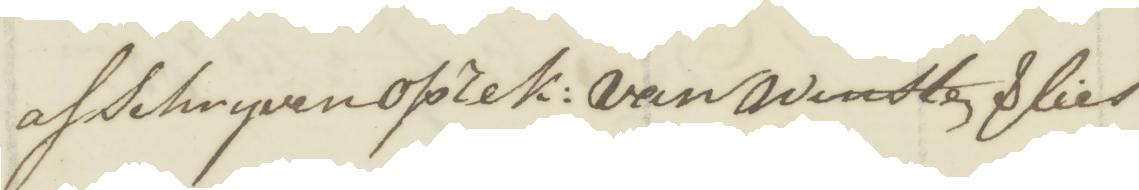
afschrijven op rek: van winsten verlies
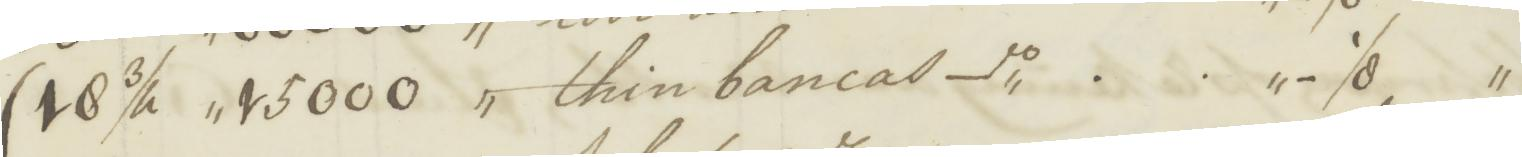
18 ¾ „ 15000 „ thin bancas _„o. . „ - 1/8 „
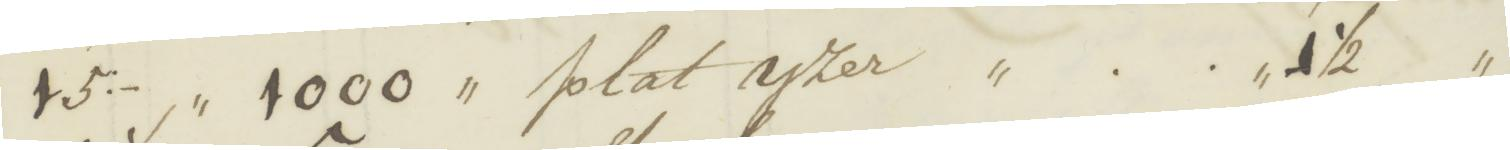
15. - „ 1000 „ plat ijzer „ . . „ 1 ½ „
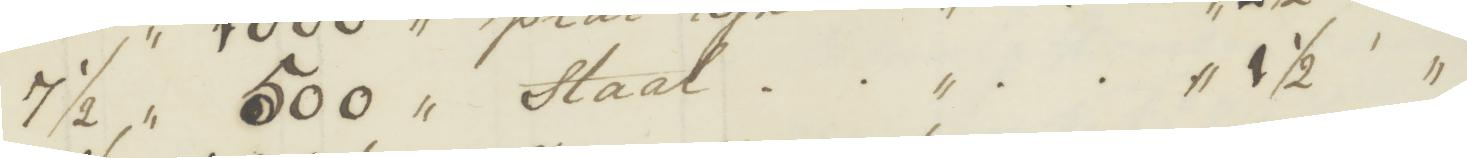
7 ½ „ 500 „ staal . . „ . . „ 1 ½ ' „
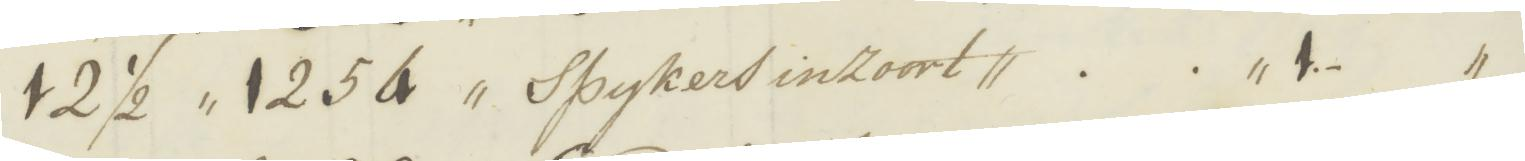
12 ½ „ 1254 „ spijkers inzoort „ . . „ 1. - „
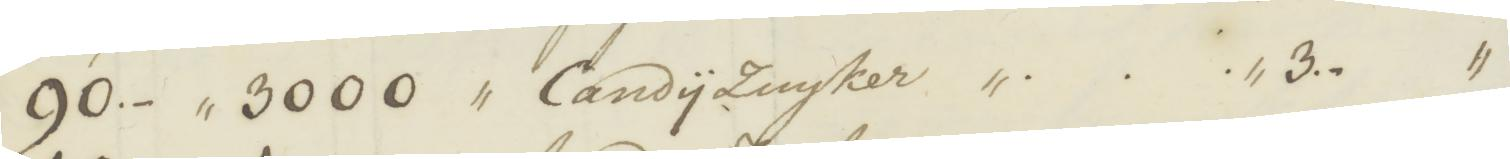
90. — „ 3000 „ Candij zuyker „ . . . „ 3. - „
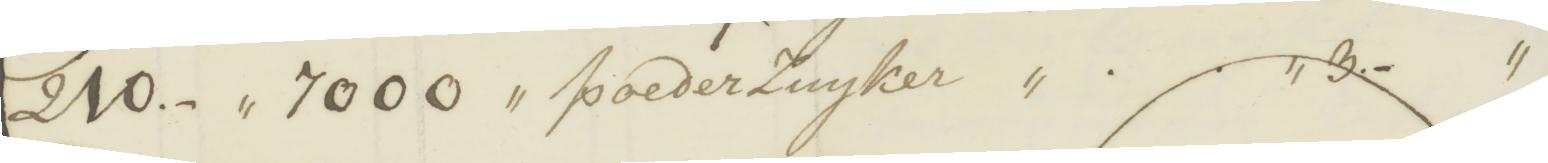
210. — „ 7000 „ poeder zuyker „ . . „ 3. - „
